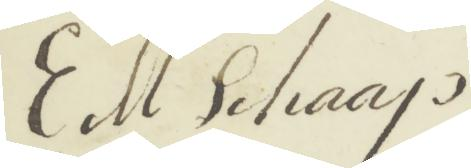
E M Schaap
